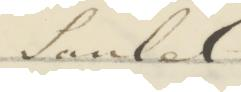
sarlet
